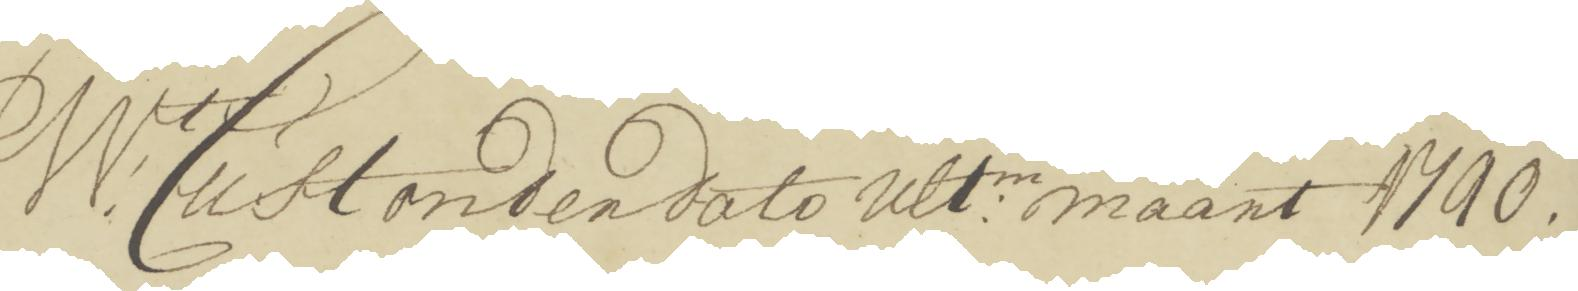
W:t Cust onder dato ult:m maart 1740.
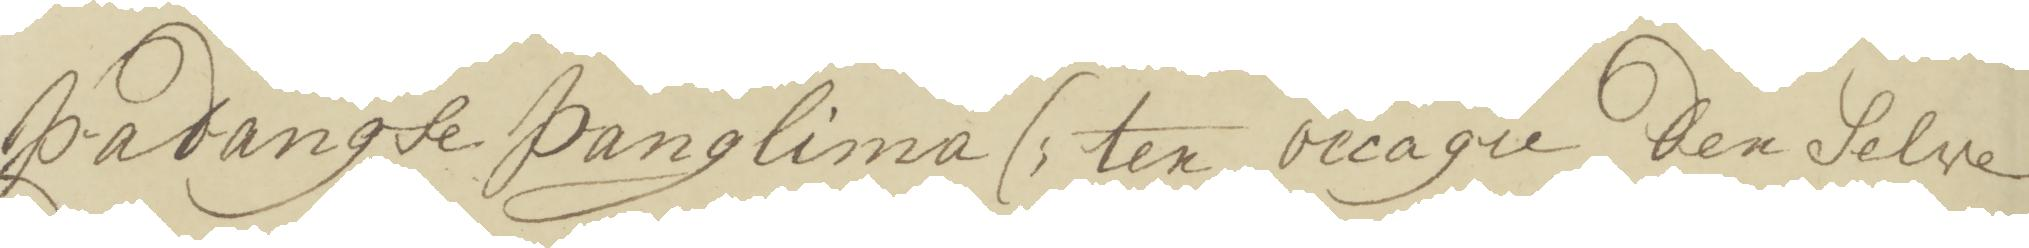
padangse panglima (:ter occagie den selve
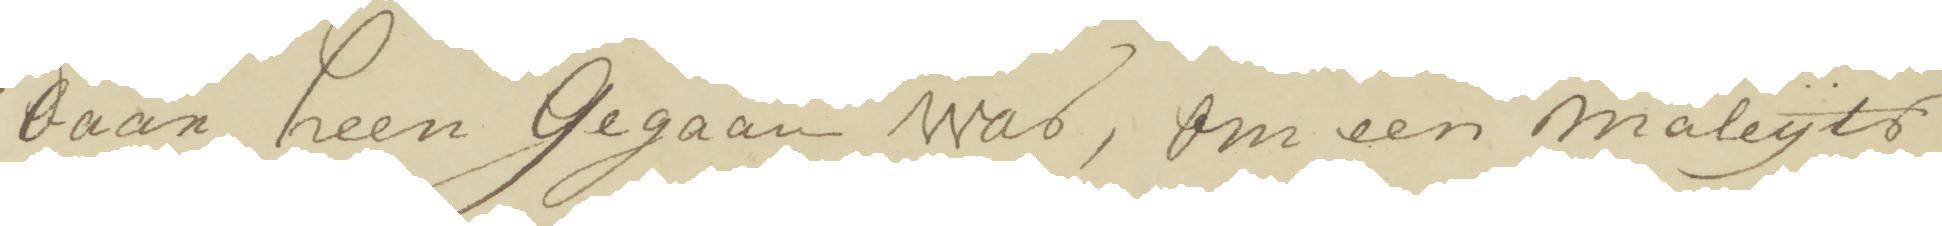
daar heen gegaan was, om een maleijts
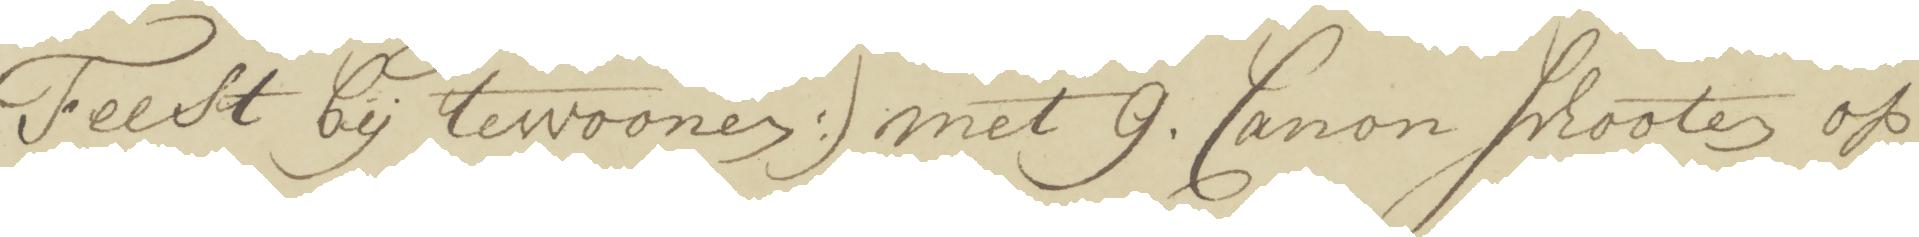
feest bij tewoonen:) met 9 canon schoote op
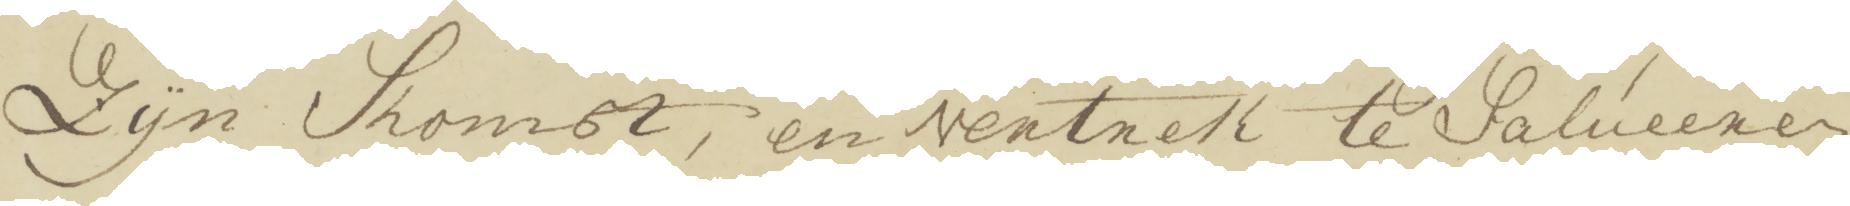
zijn komst, en vertrek te salueeren,
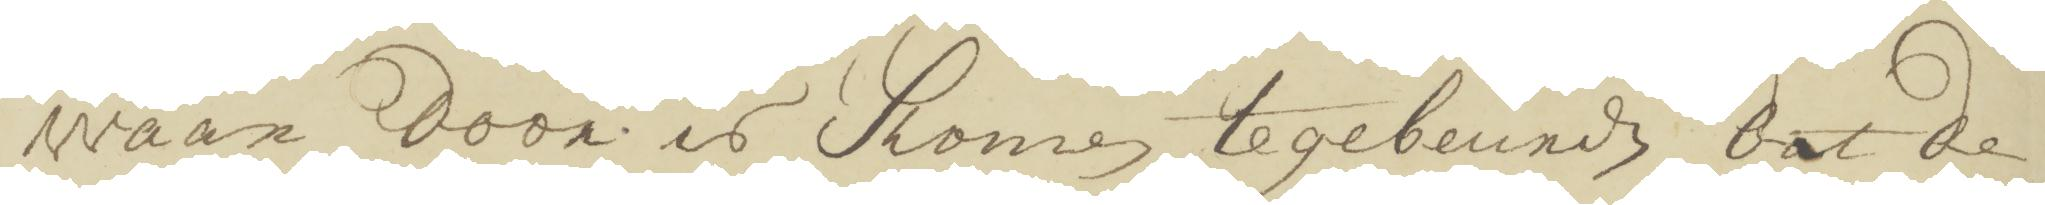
waar door is komen te gebeuren dat de
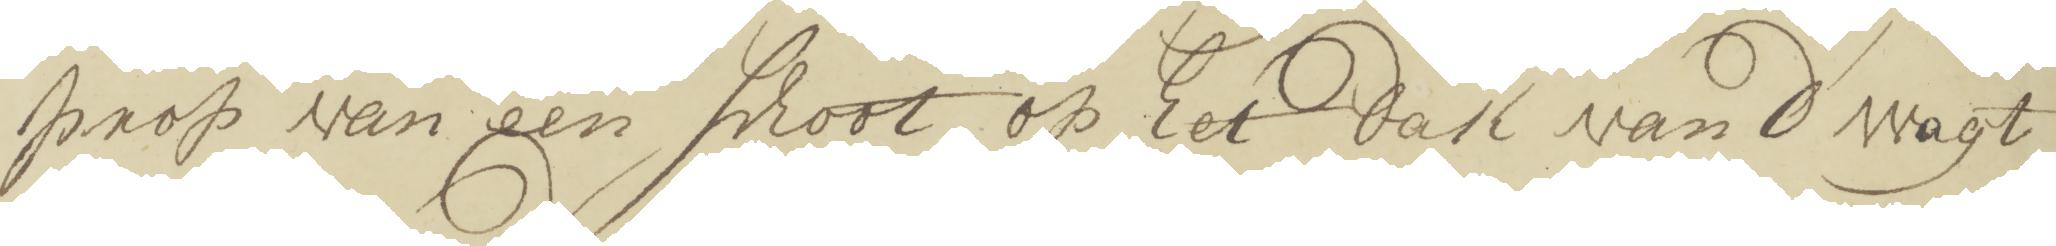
prop van een schoot op het dak van d’ wagt
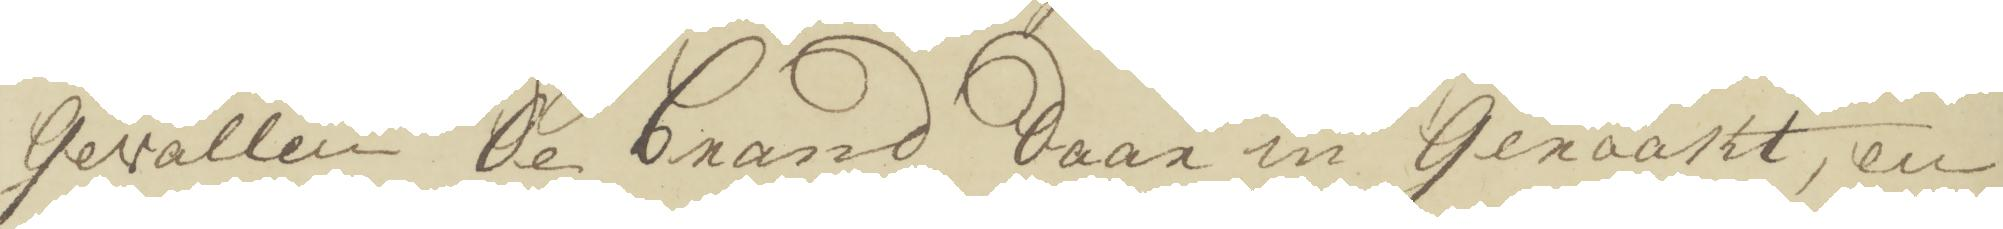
gevallen de brand daar in geraakt, en
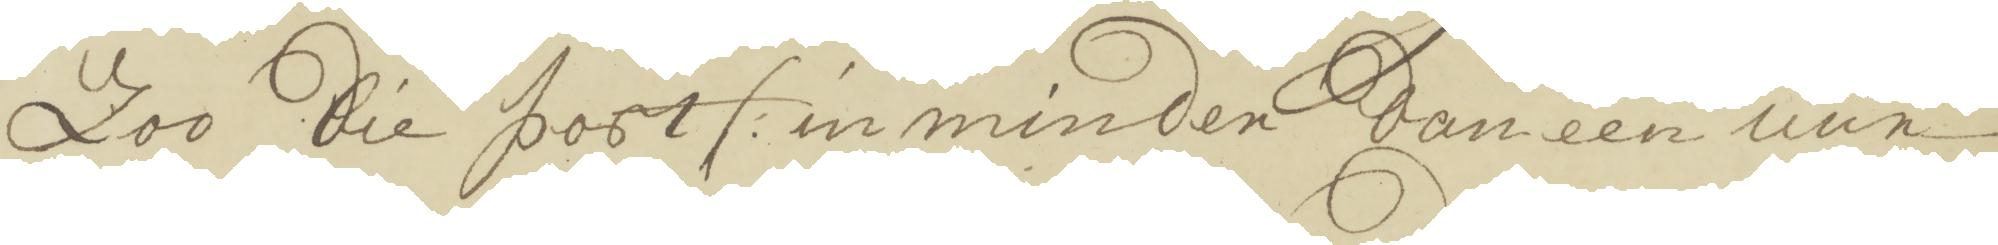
zoo die post (:in minder dan een uur
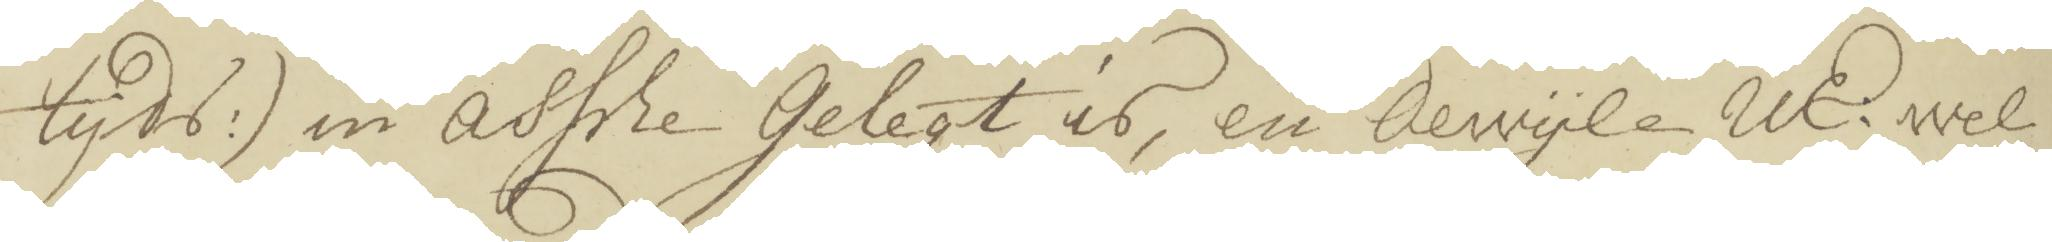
tijds:) in assche gelegt is, en dewijle UE: wel
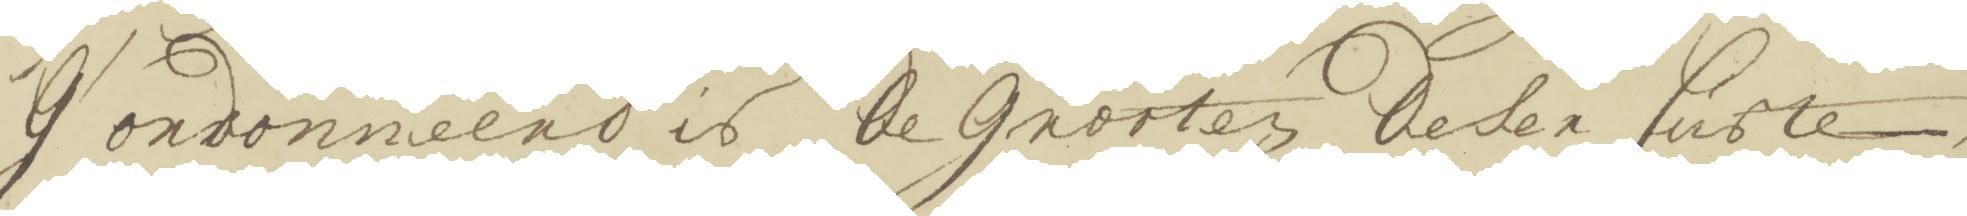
g’ordonneerd is de grooten deser Custe
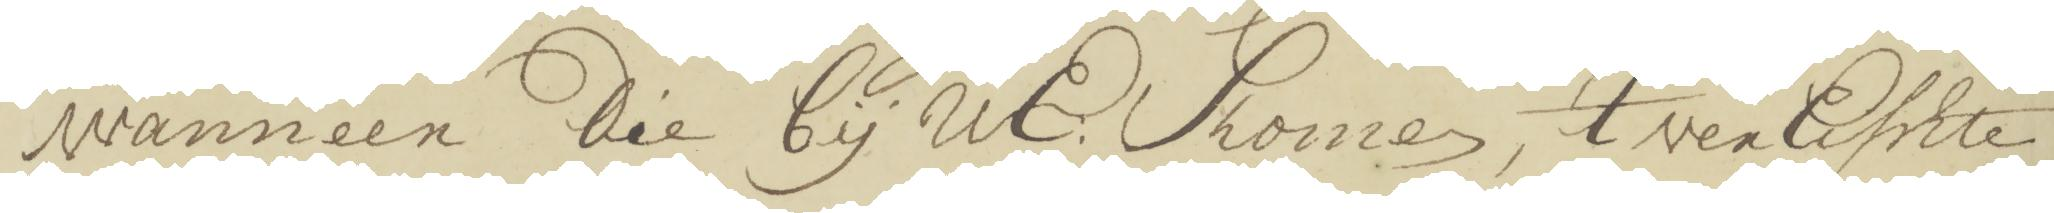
wanneer die bij UE: komen, ’t verEischte
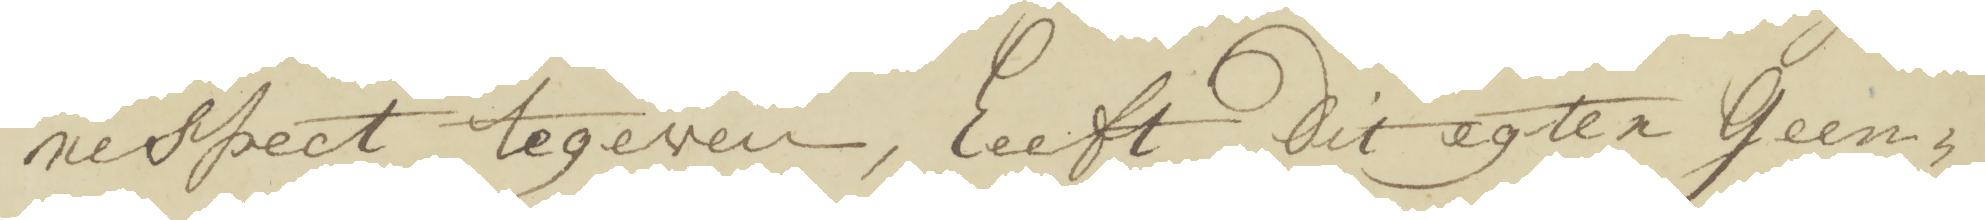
respect tegeven, heeft dit egter geen„
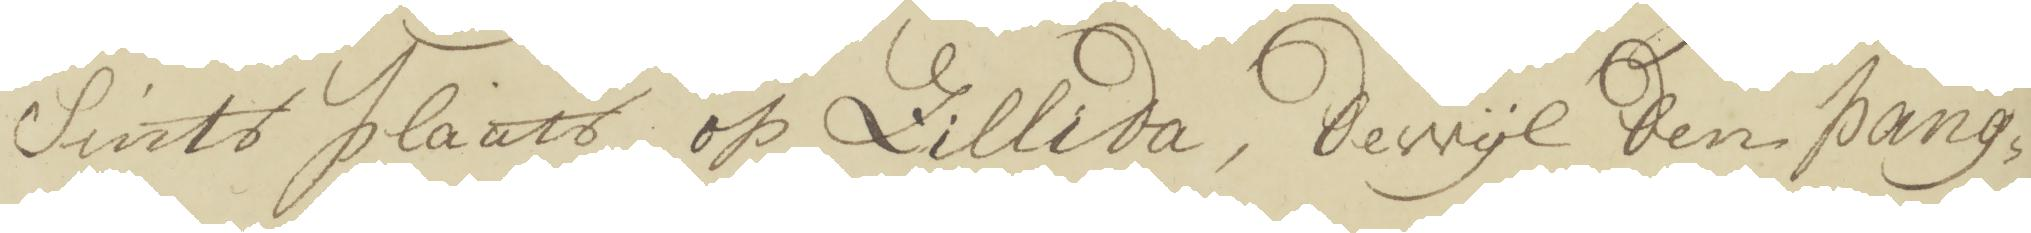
sints plaats op Zillida, dewijl den pang„
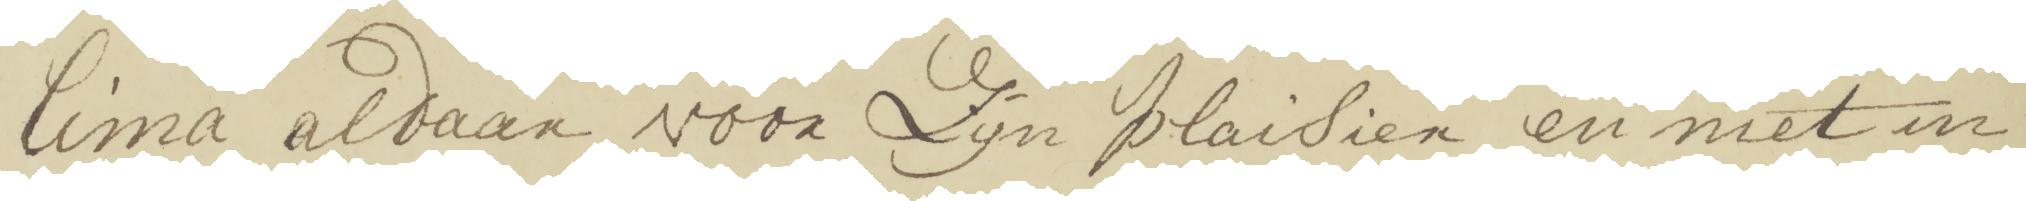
lima aldaar voor zijn plaisier en niet in
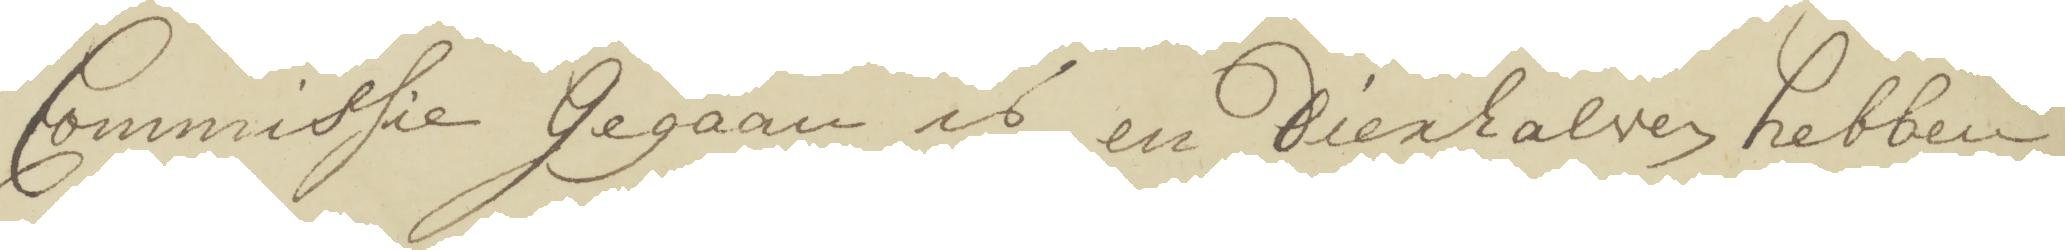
Commissie gegaan is en dierhalven hebben
